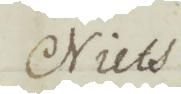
Niets
